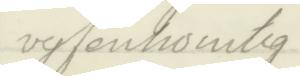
vyfentwintig
